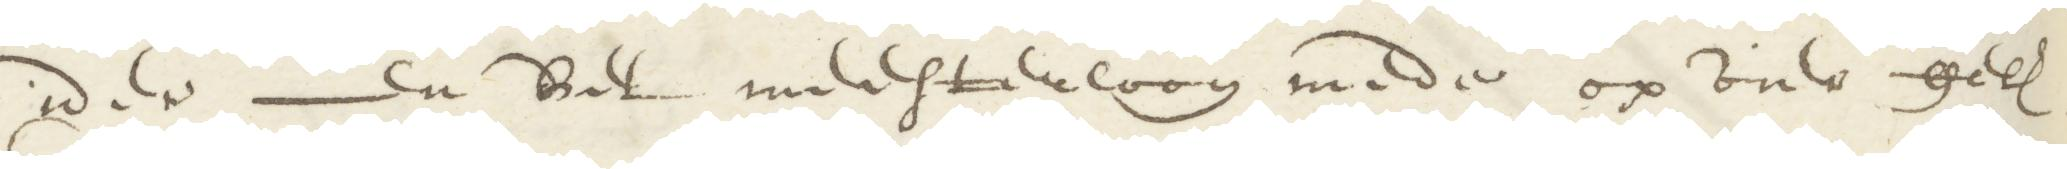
ider En het meesterloon mede op vier gelver
